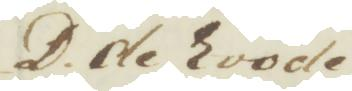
D. de Roode
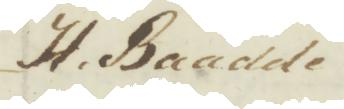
H. Baadde
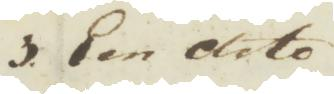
3. Een dito
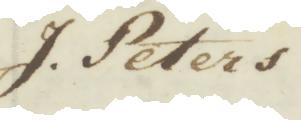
J. Peters
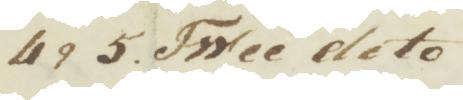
4 & 5. Twee dito
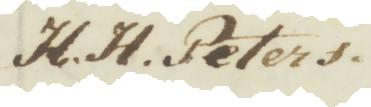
H. H. Peters.
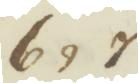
6 & 7
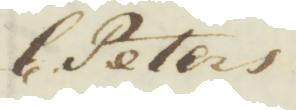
C. Peters
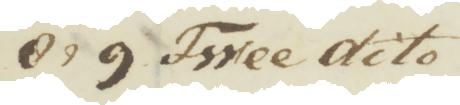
8 & 9 Twee dito
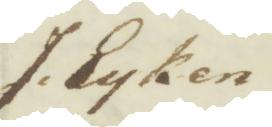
J: Eyken
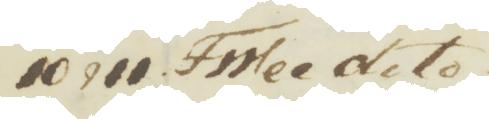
10 & 11 Twee dito
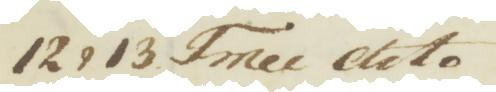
12 & 13. Twee dito
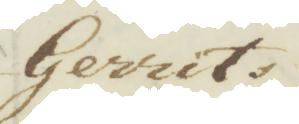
Gerrits
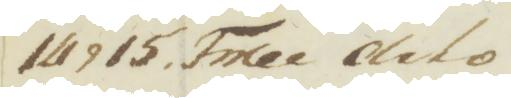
14 & 15. Twee dito
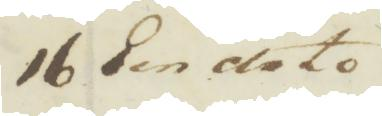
16 Een dito
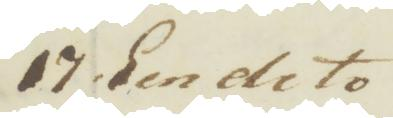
17: Een dito
